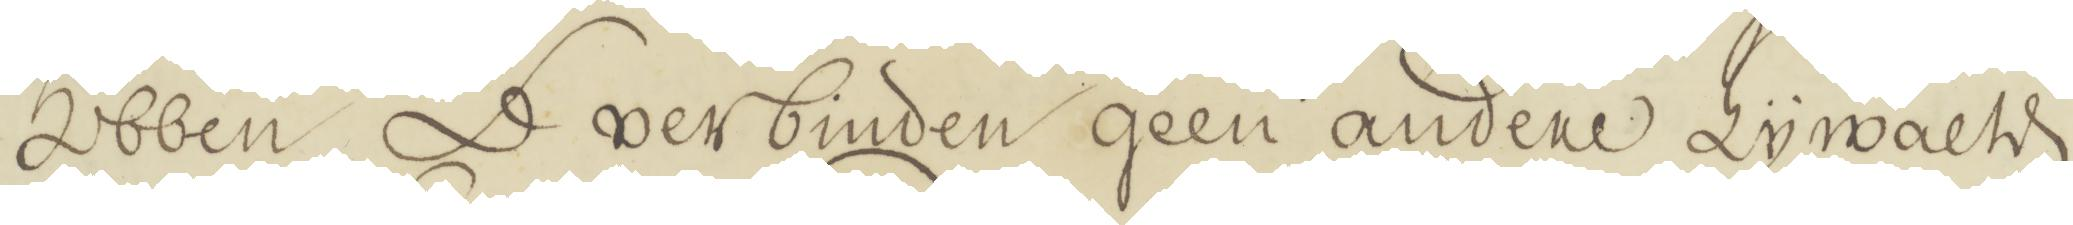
hebben te verbinden geen andere Lijwaeten
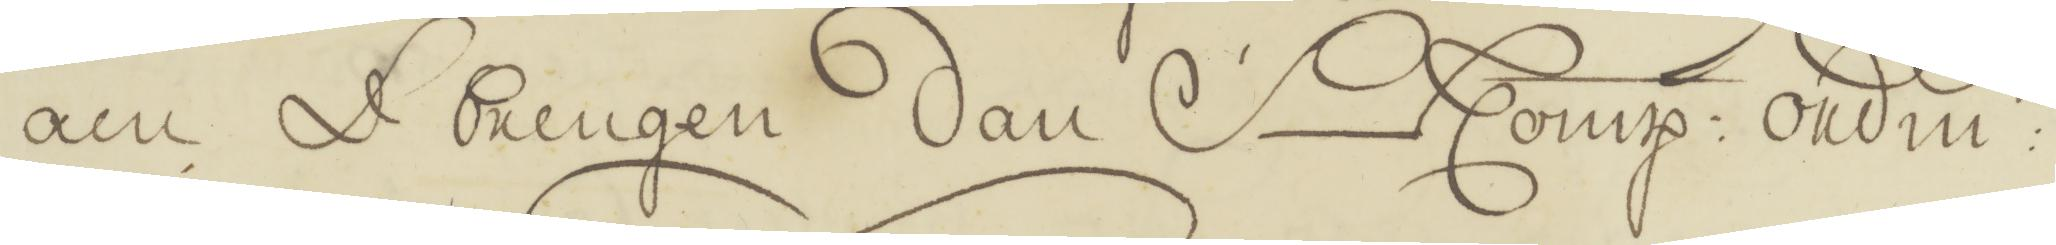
aen te brengen dan 'S EComp: ordin:te
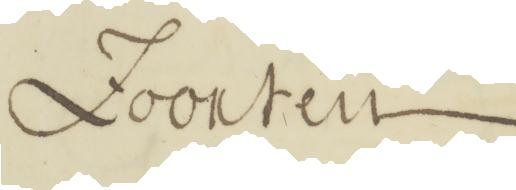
Zoorten
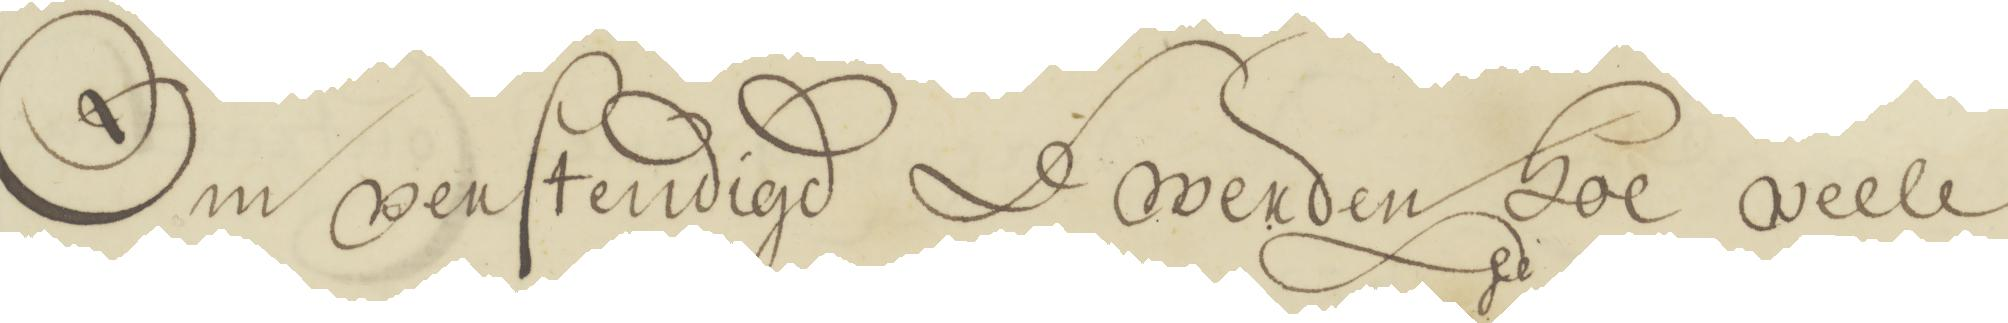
Om verstendigd te werden hoe veele
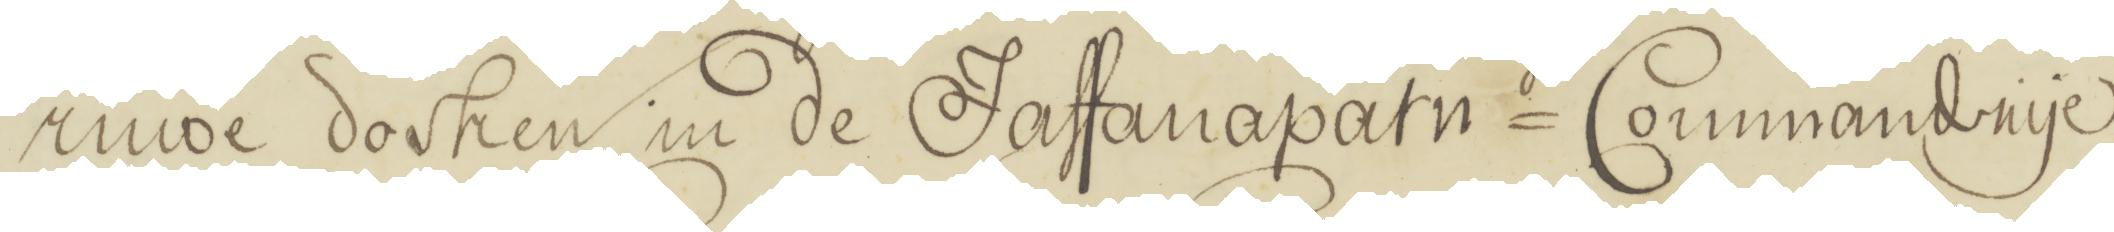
ruwe doeken in de Iaffanapatn=se Commanderije
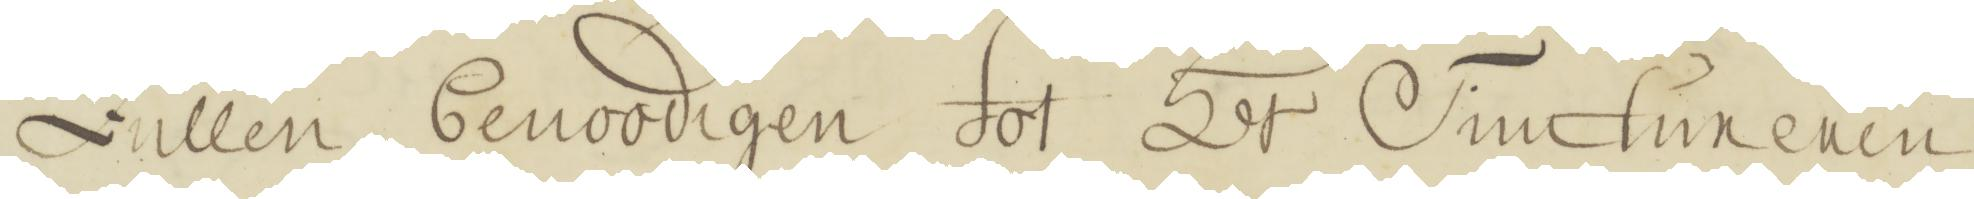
Zullen benoodigen tot het Tinctureren
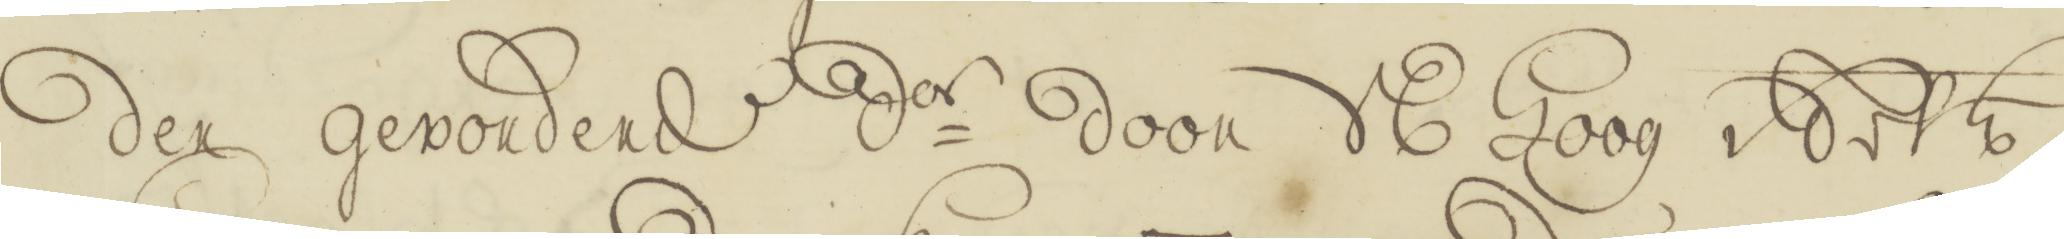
der gevorderd d=os door VE Hoog Edelh:s
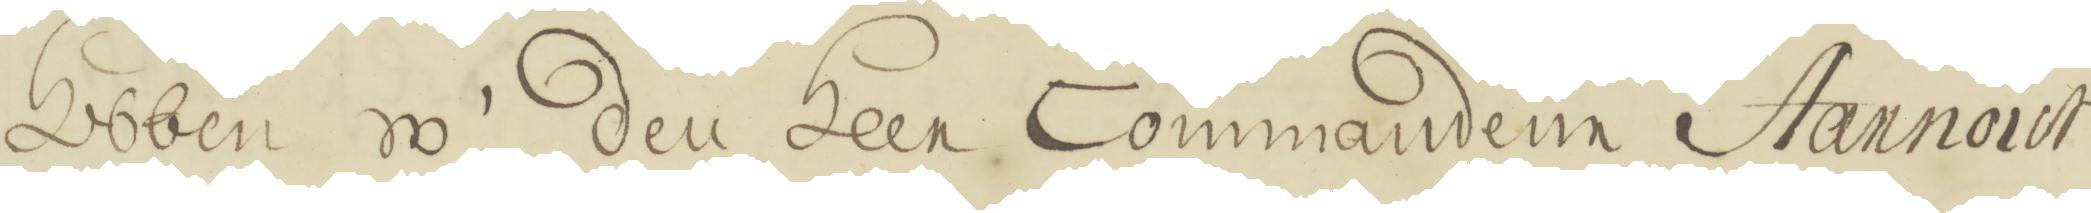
hebben w' den heer Commandeur Aarnout
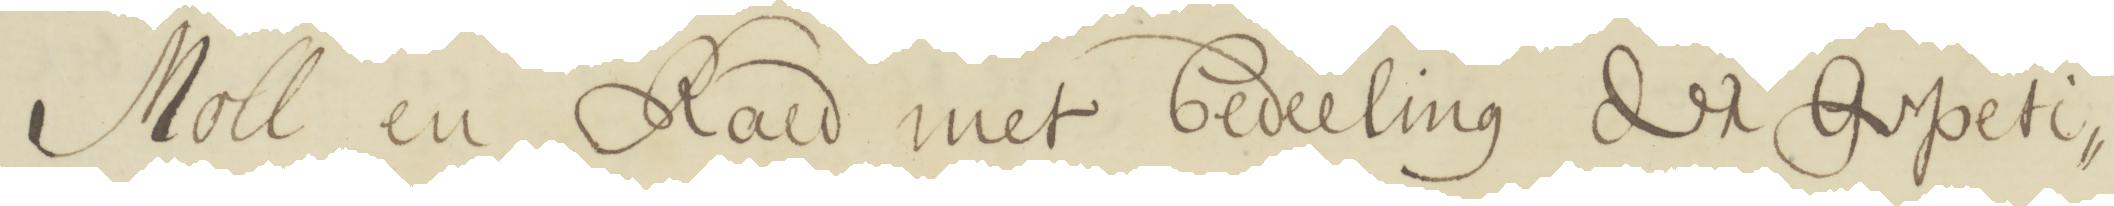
Moll en Raed met bedeeling der gepeti„
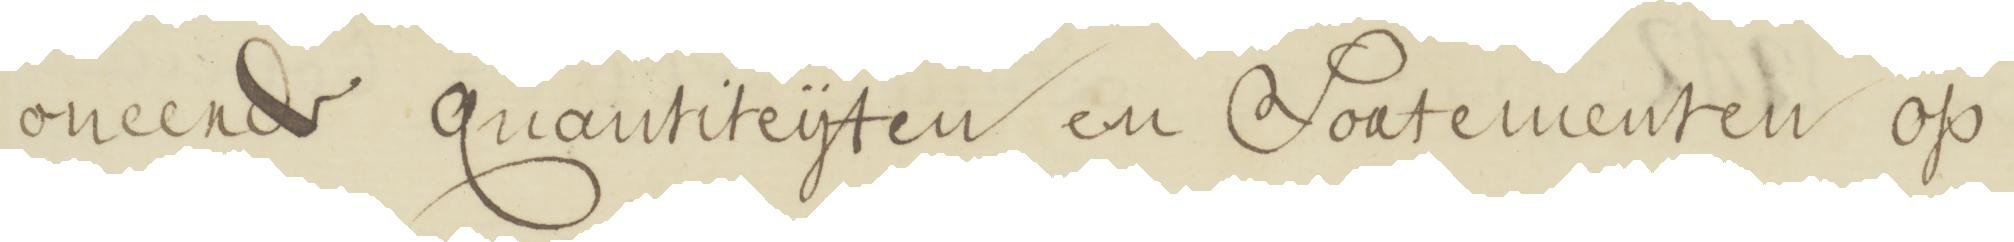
oneerde quantiteijten en Sortementen op
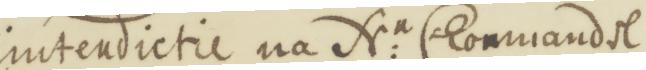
interdictie na N:r Chormandel
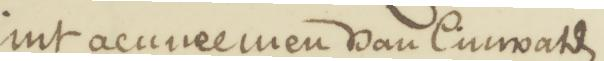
int aenneemen van Cinwaten
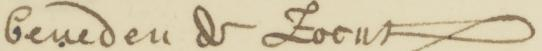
beneden de zoort
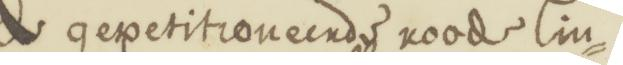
de gepetitioneerde roode lin„
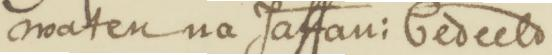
waten na Jaffan: bedeeld
